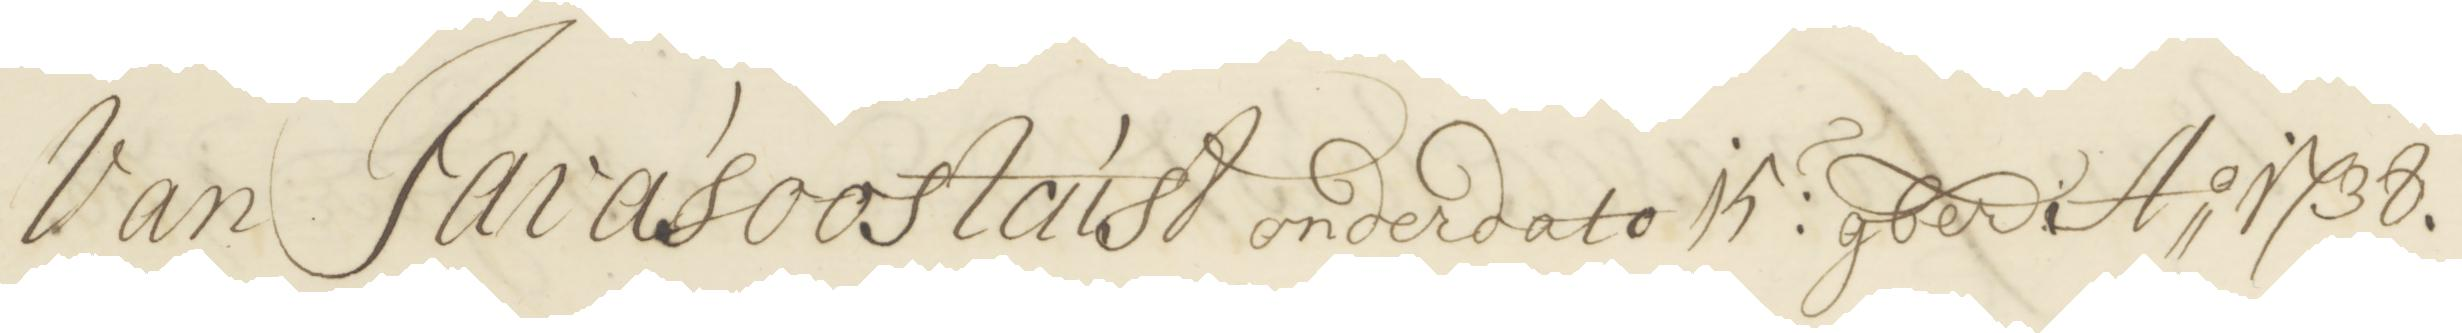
Van Java's oost cust onder dato 15:' 9ber A„o 1738.
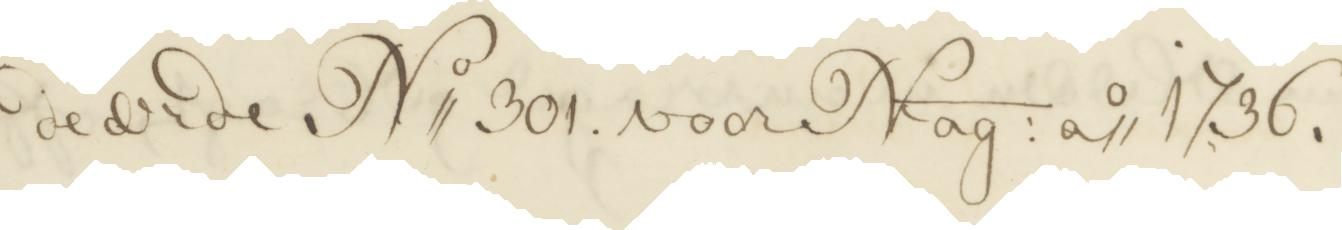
de derde N„o 301: voor Nag: a„o 1736.
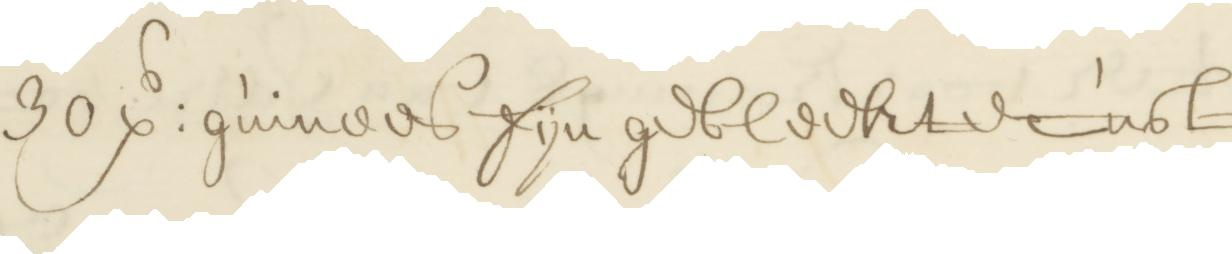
30 p:s guinees fijn gebleekte cust
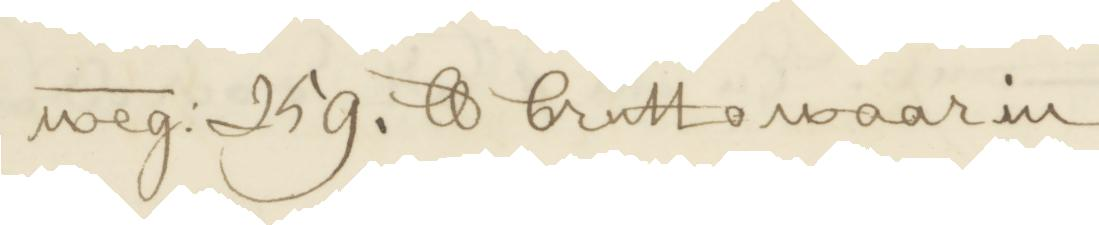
weg: 259. lb brutto waar in
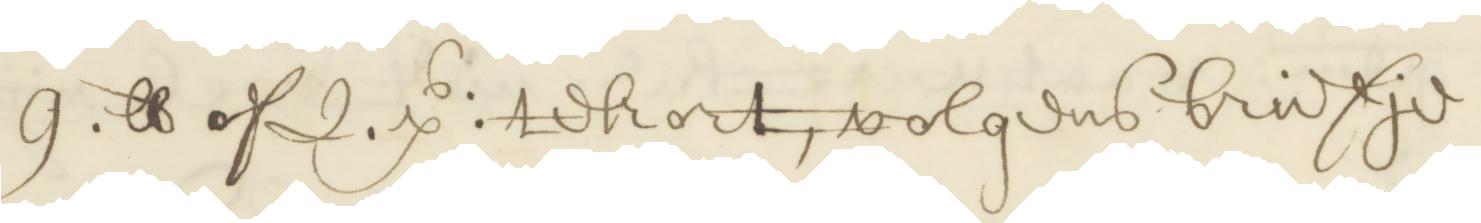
9. lb of 2. p:s tekort, volgens briefje
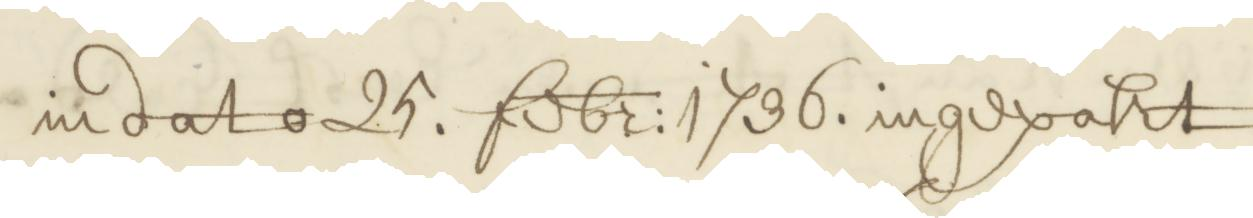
in dato 25. febr: 1736. ingepakt
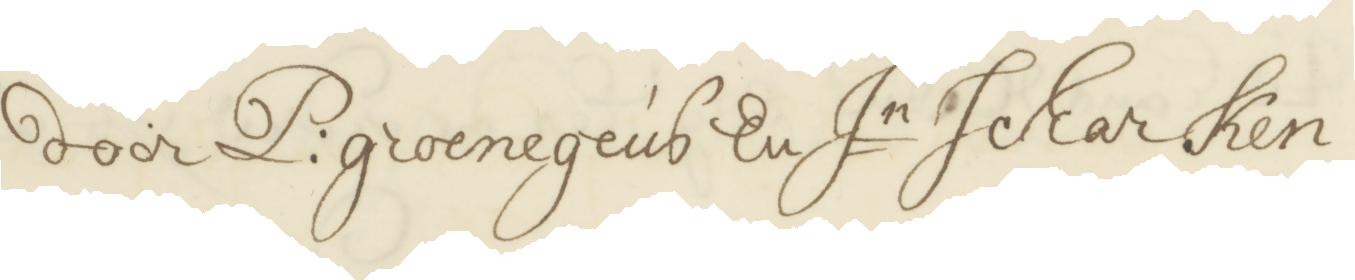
door P: groenegeus En J=n Scharken
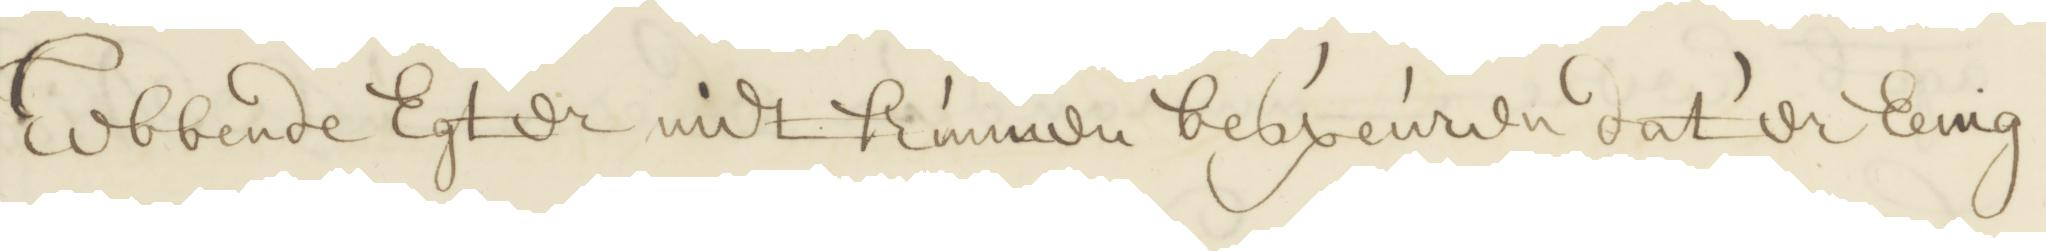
hebbende Egter niet kunnen bes'peuren dat'er Eenig
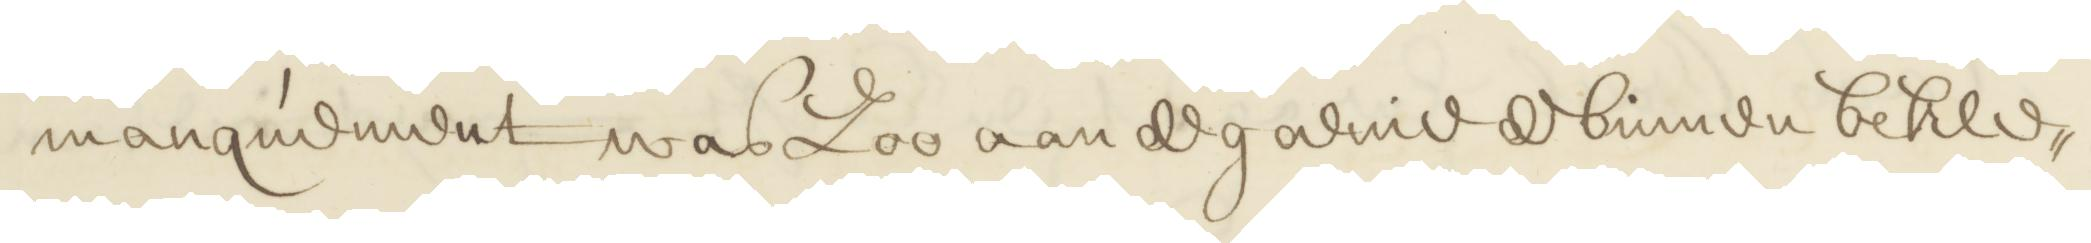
manquement was zoo aan de goenie de binnen bekle„
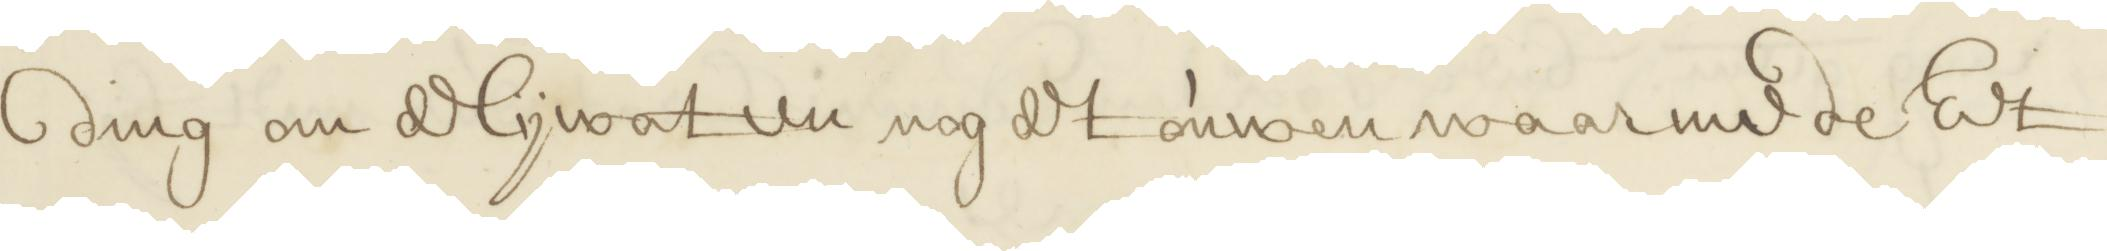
ding om delijwaten nog de touwen waarmede het
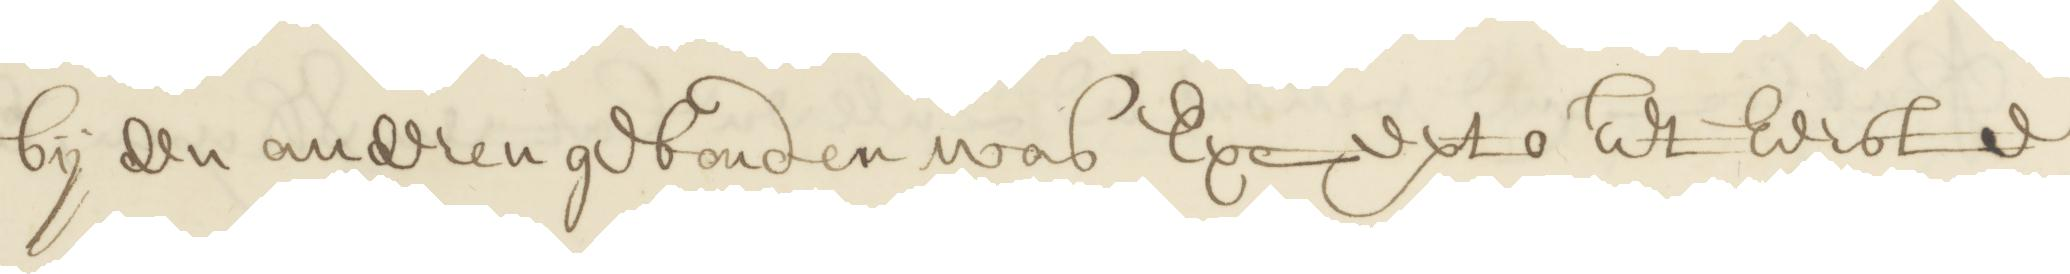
bij den anderen gebonden was Excepto het Eerste
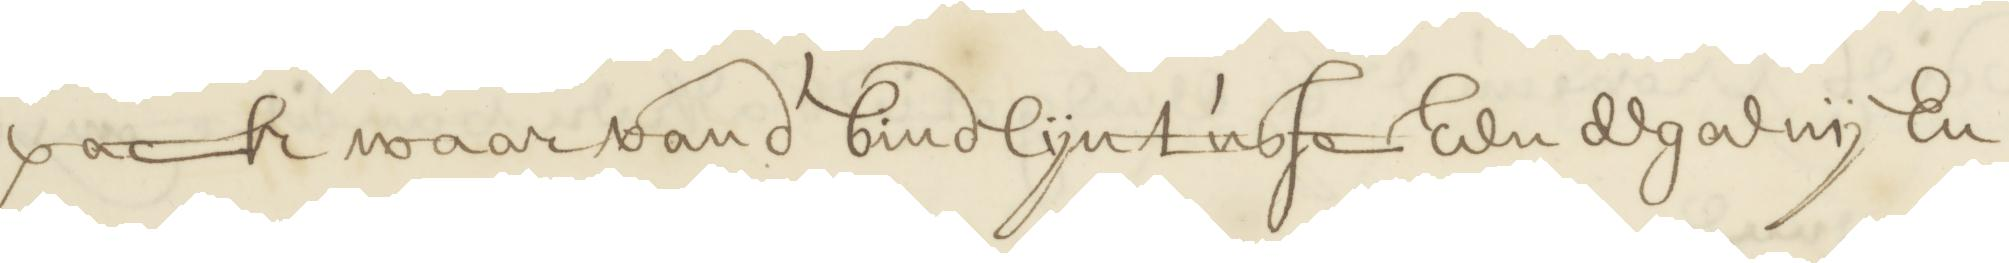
pack waar van d’ bindlijn tusschen degoenij En
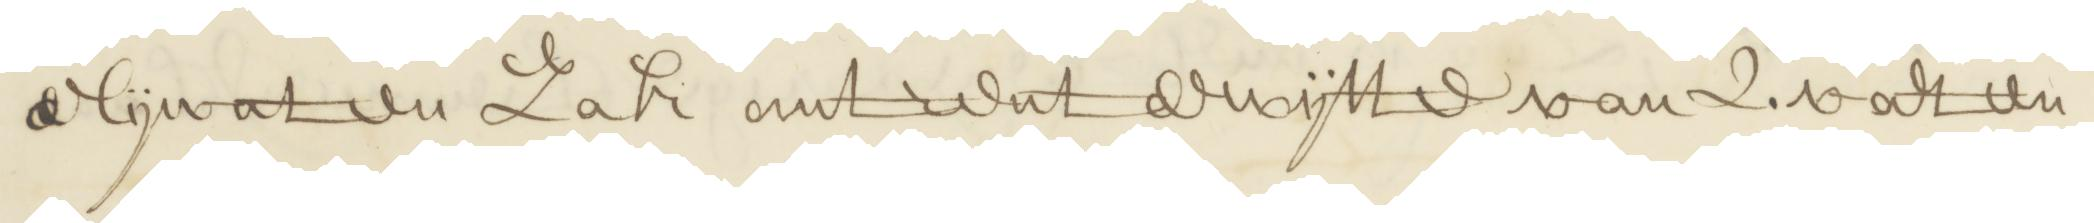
delijwaten zak omtrent dewijtte van 2. voeten
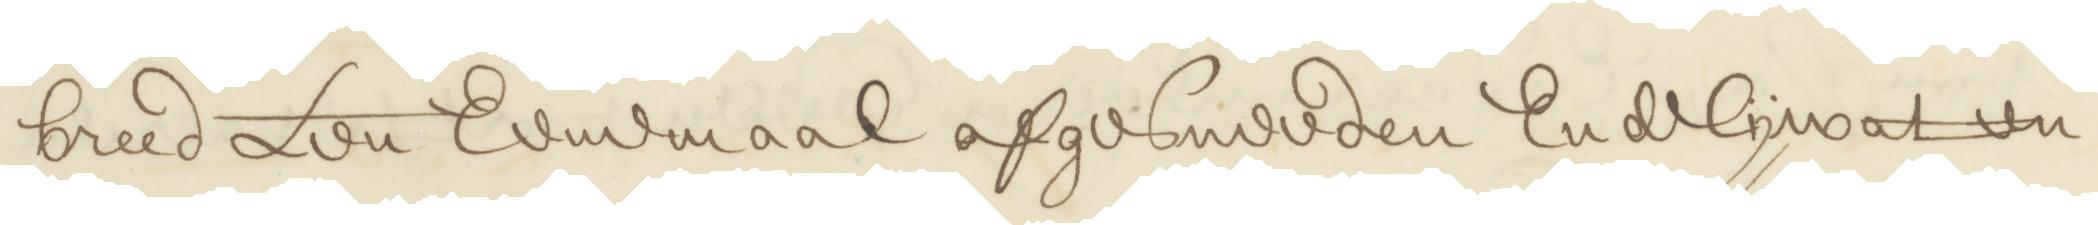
breed ten Eenemaal afgesneeden En delijwaten
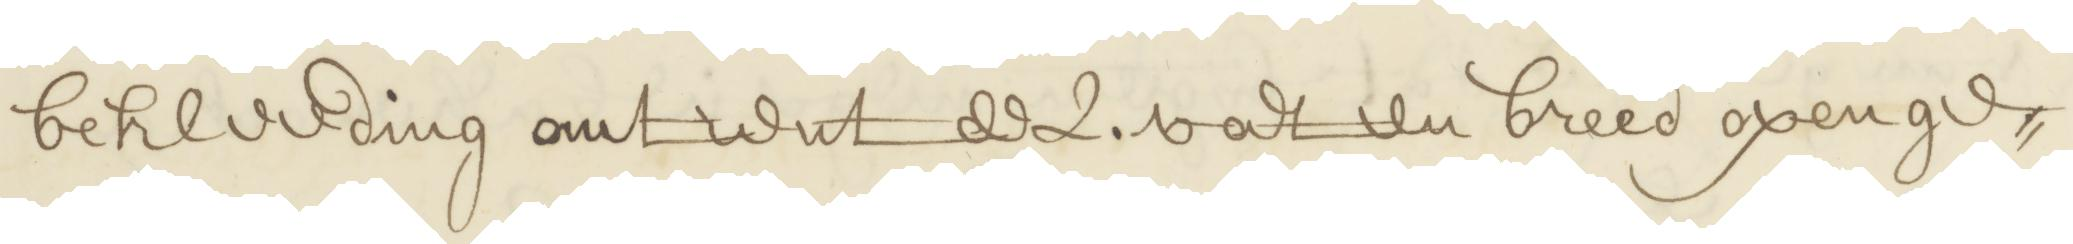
bekleeding omtrent de 2. voeten breed open ge„
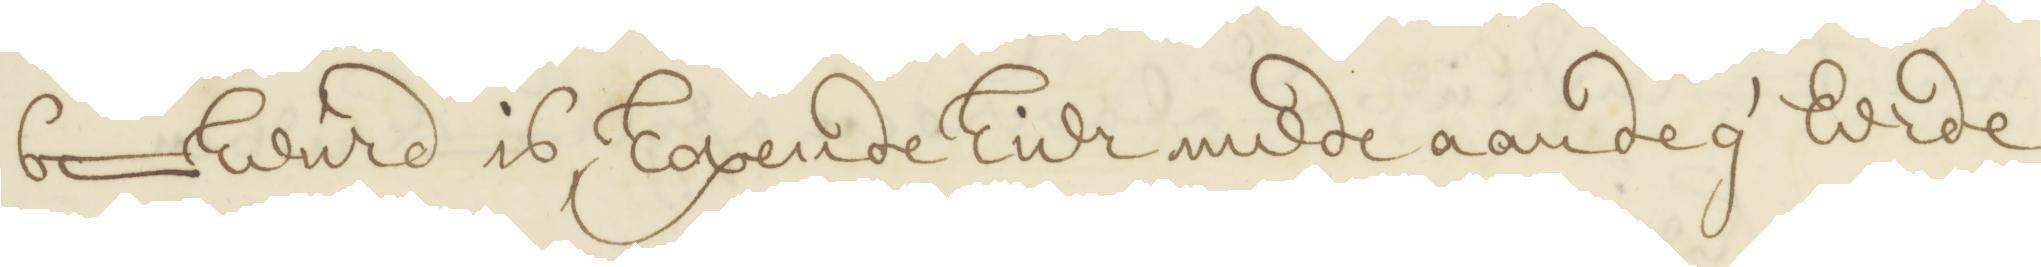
scheurd is, hopende hier mede aan de g’ Eerde
